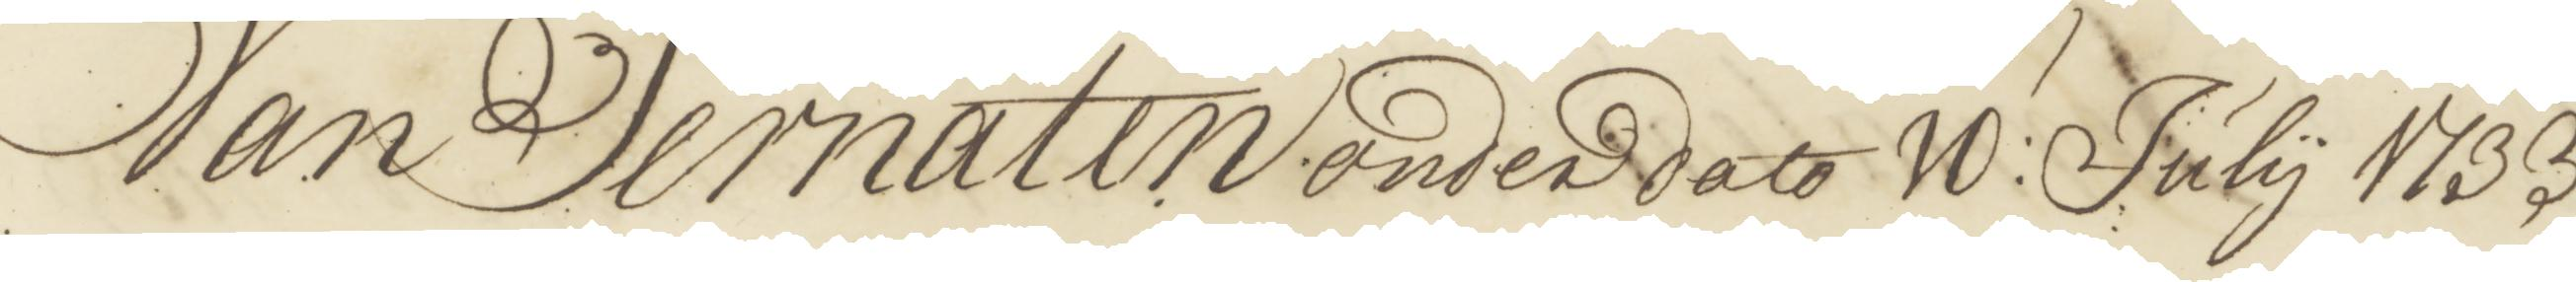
Van Ternaten onder dato 10:' Julij 1733
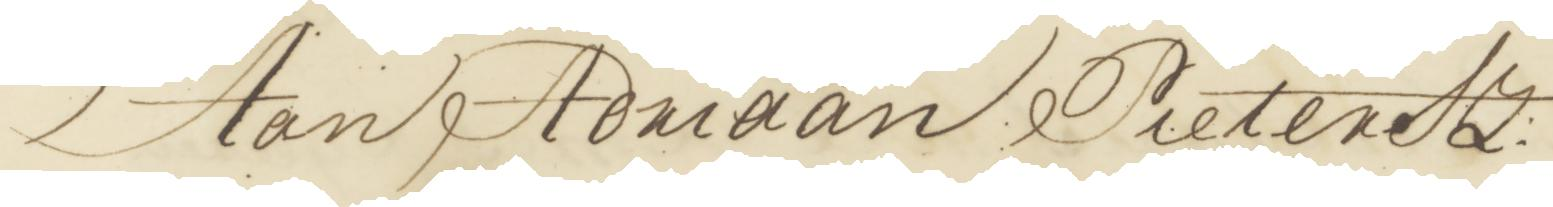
Aan Adriaan Pietersz:
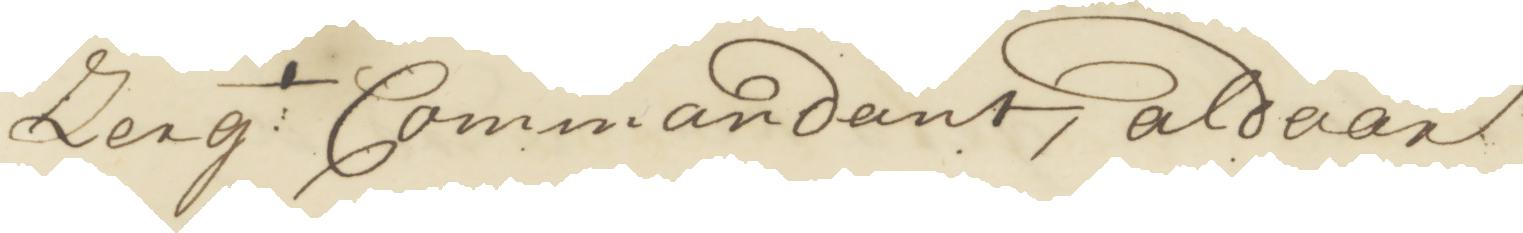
Zerg:t Commandant, aldaar
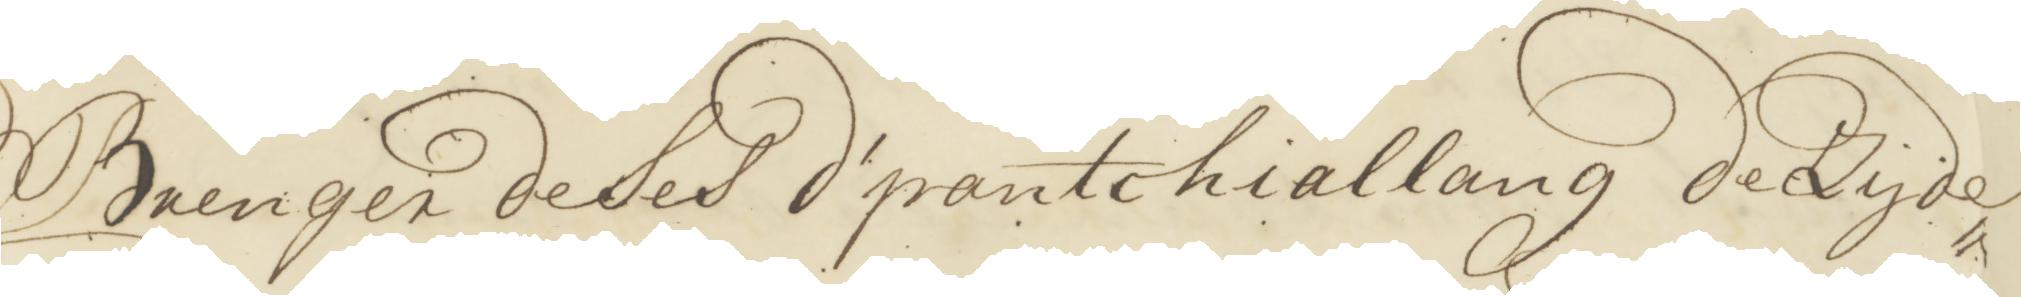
Brenger deses d'pantchiallang de zijde„
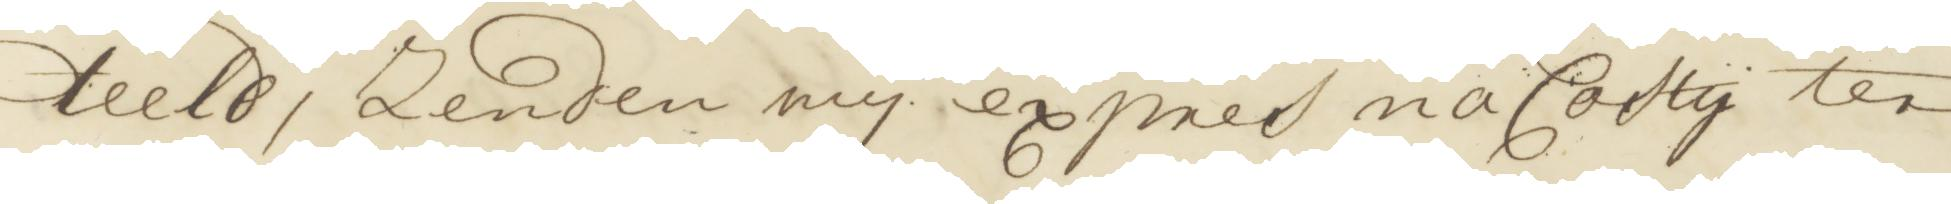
teeld, Zenden mij expres na Costij ter
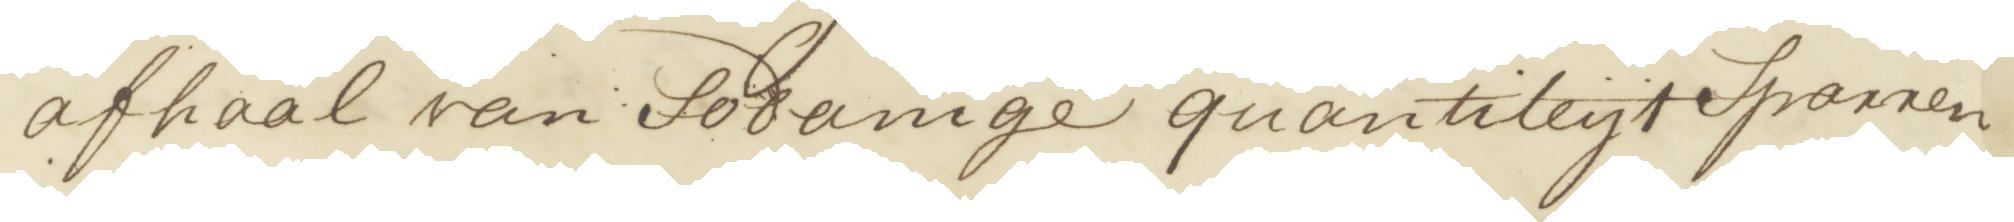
afhaal van sodanige quantiteijt sporren
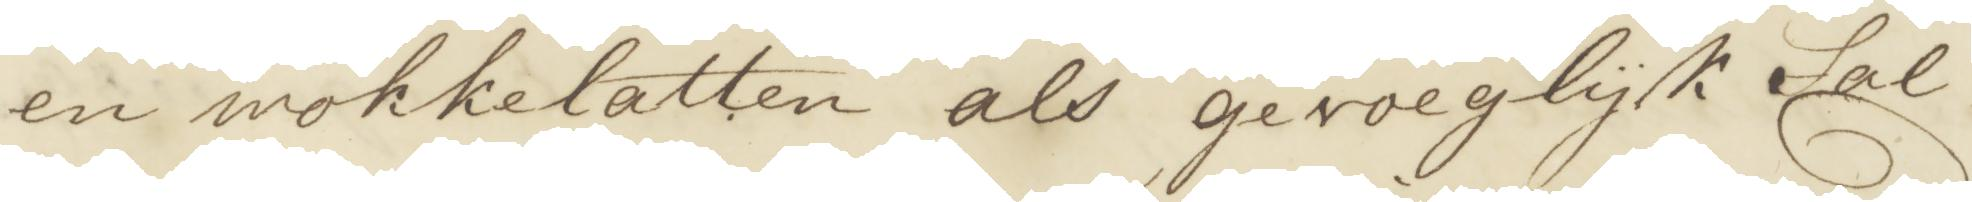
en wokkelatten als gevoeglijk sal
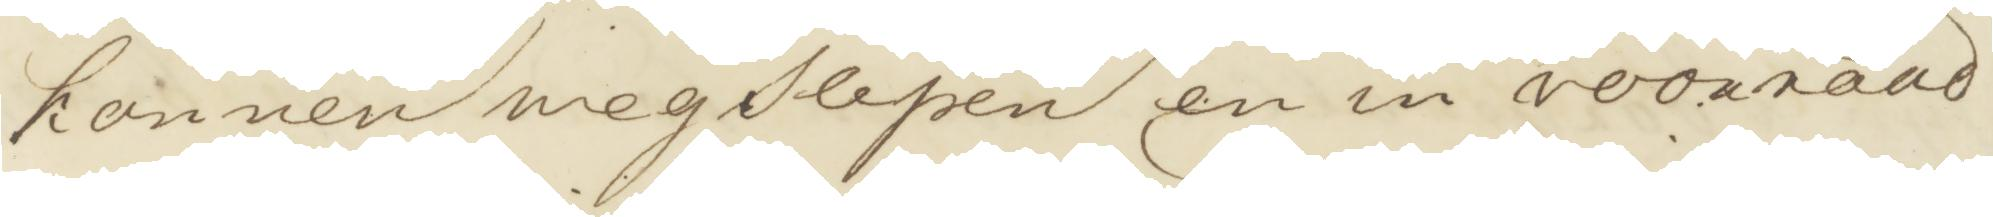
konnen wegslepen en in voorraad
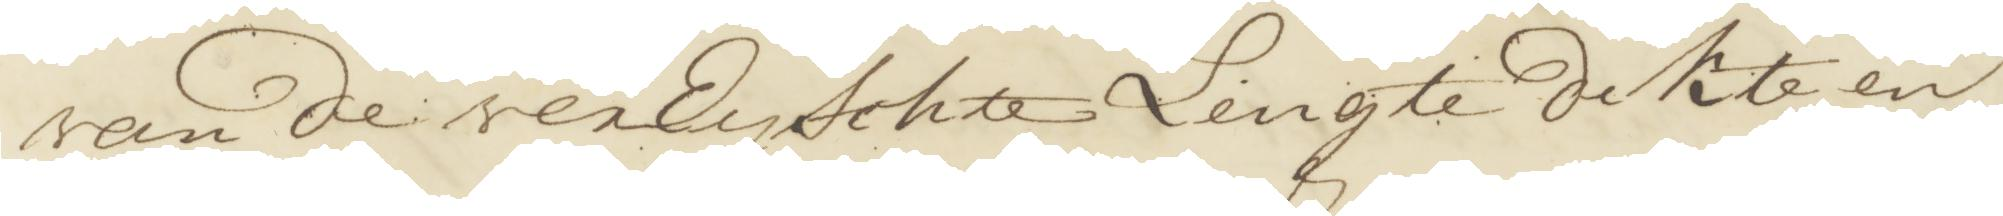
van de verEyschte Lengte dikte en
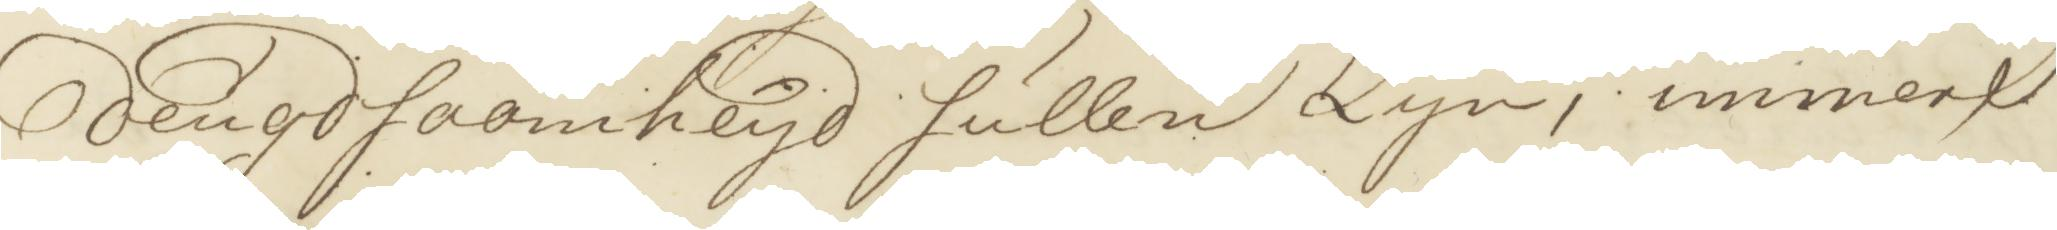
deugdsaamheijd sullen zijn, immers
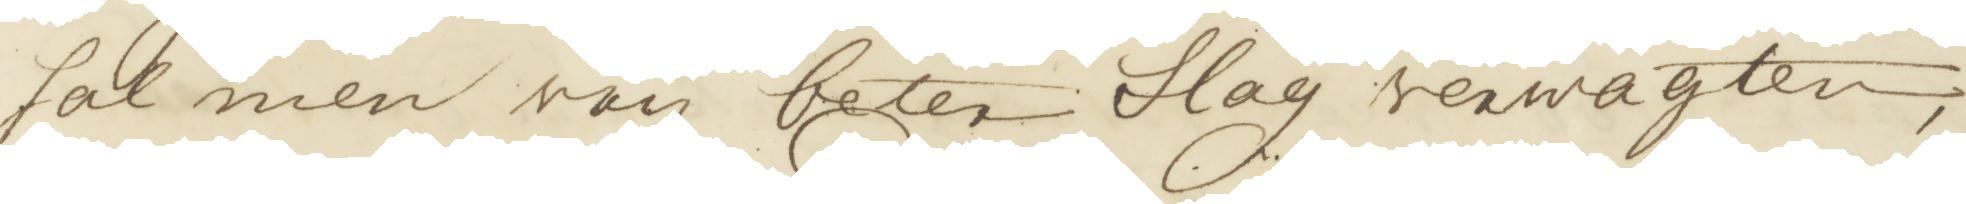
sal men vrij beter slag verwagten,
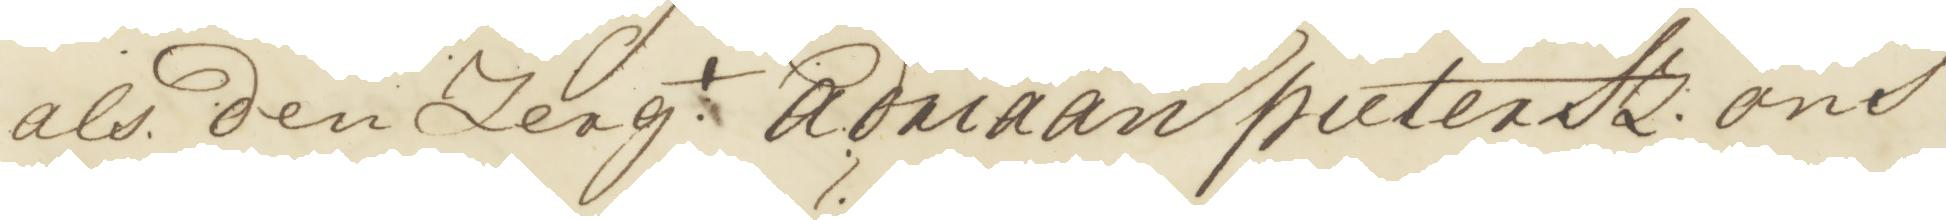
als den Zerg:t adriaan pietersz: ons
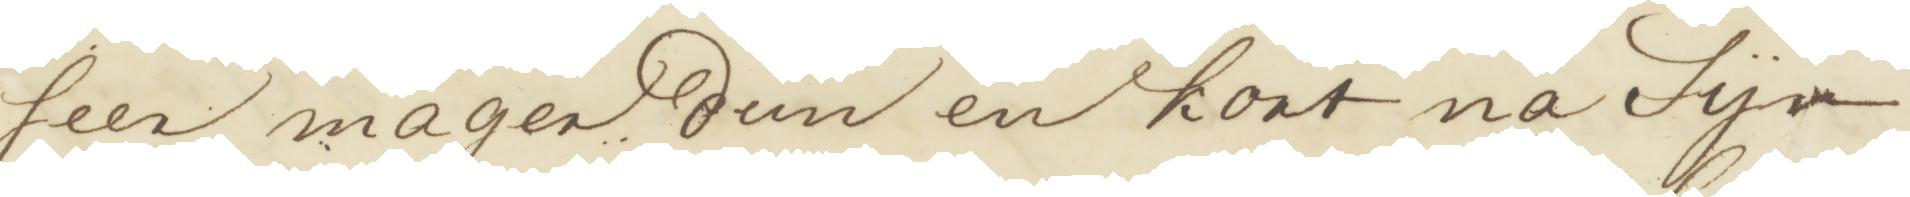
seer mager dun en kort na sijn
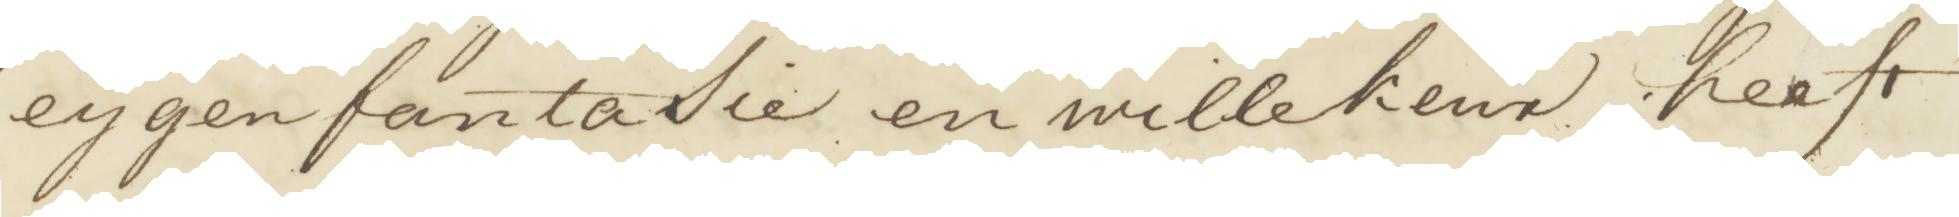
eijgen fantasie en willekeur heeft
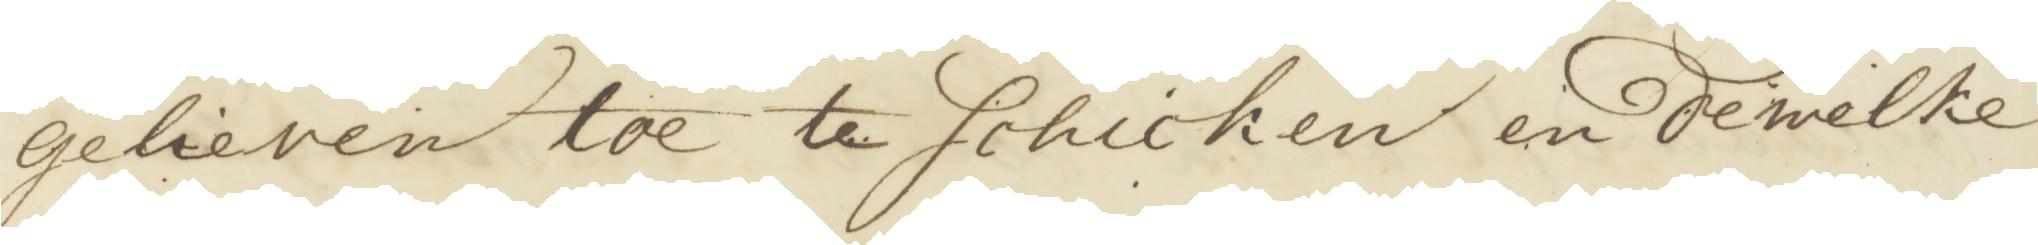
gelieven toe te schicken en dewelke
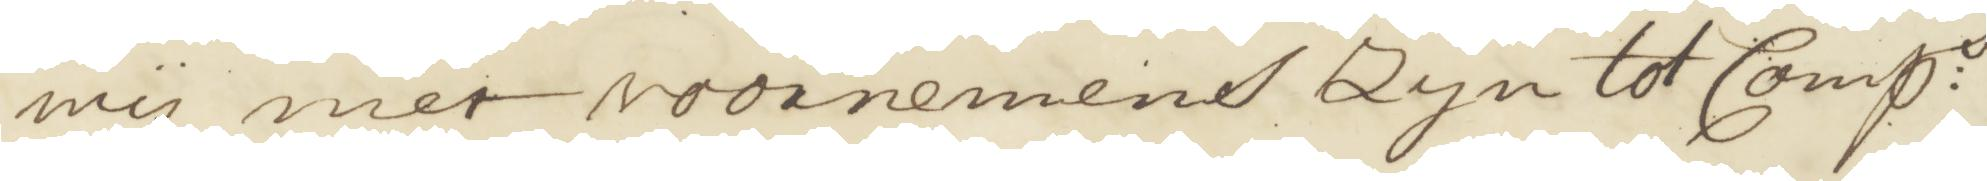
mij met voornemens zijn tot Comp:s
